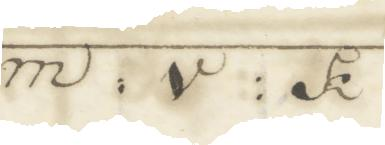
m : v : k
